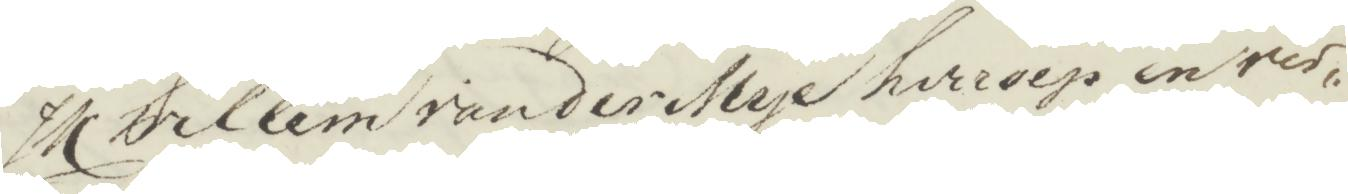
Jk willem van der Mye herroep en ver„
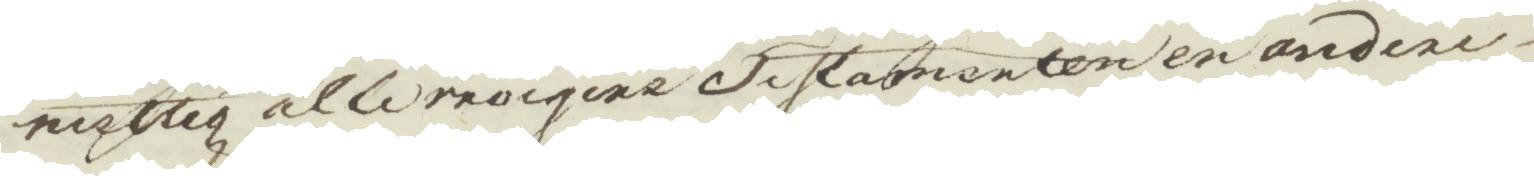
niettig alle vroegere Testamenten en andere
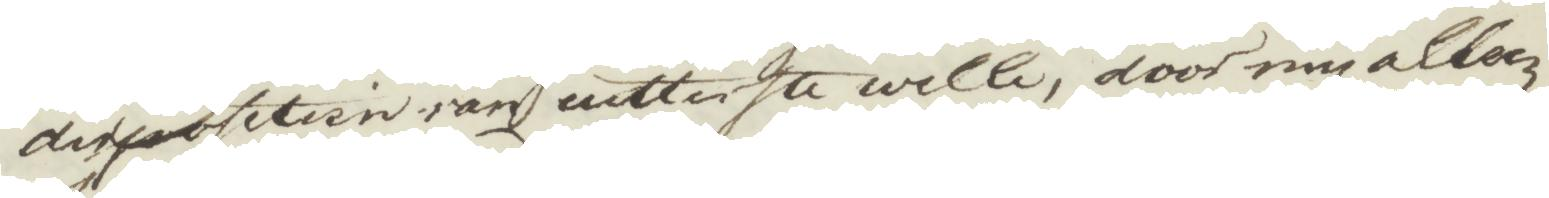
dispositien van uitterste wille, door my alleen
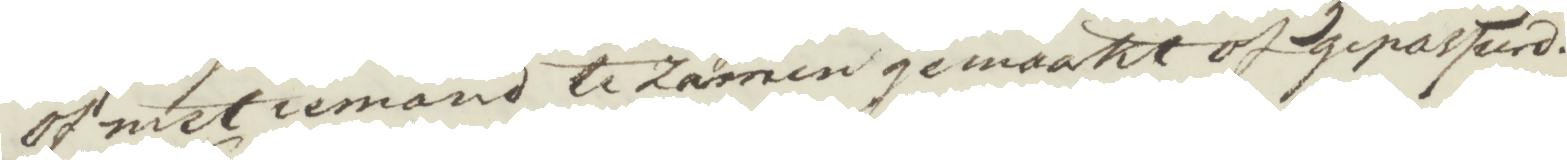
of met iemand te zamen gemaakt of gepasseerd.
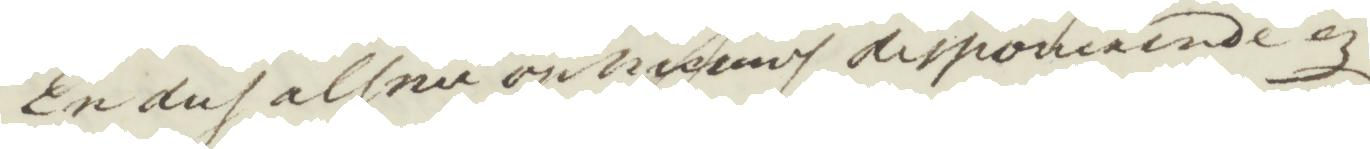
En dus als nu opnieuws disponerende en
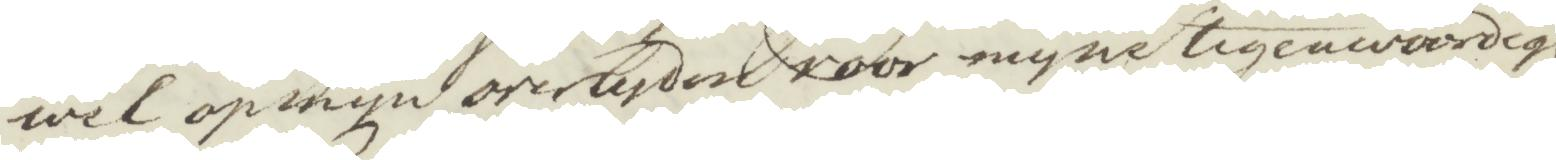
wel op myn overlyden voor myne tegenwoordige
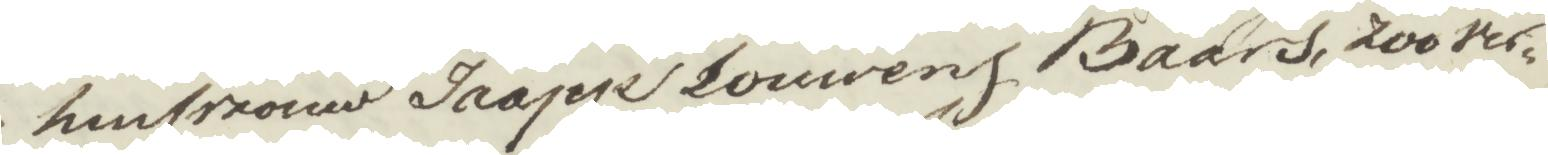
„huisvrouw Iaapje Louwens Baars, zoo ver„
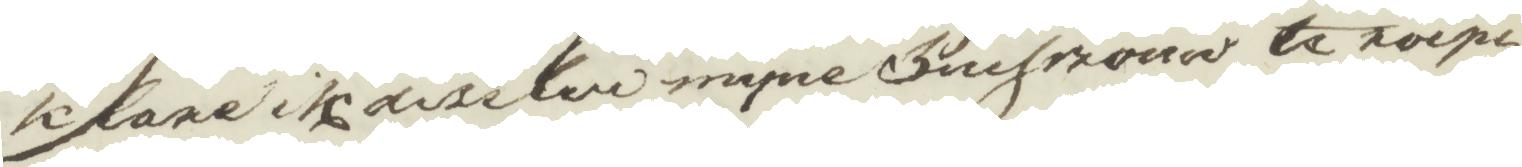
klare ik dezelve myne huisvrouw te roepen
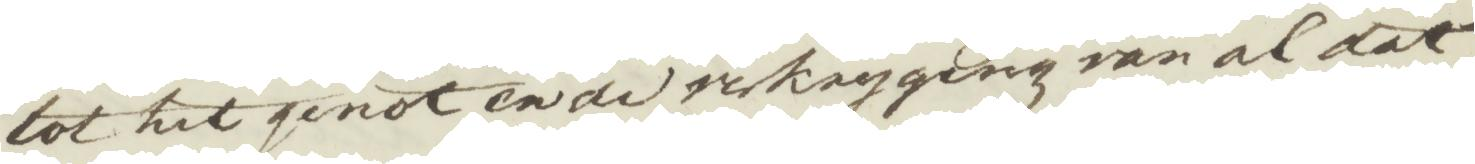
tot het genot en de verkryging van al dat
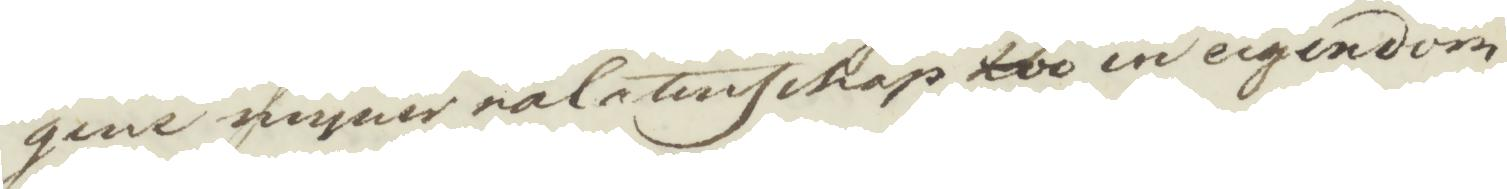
gene myner nalatenschap zoo in eigendom
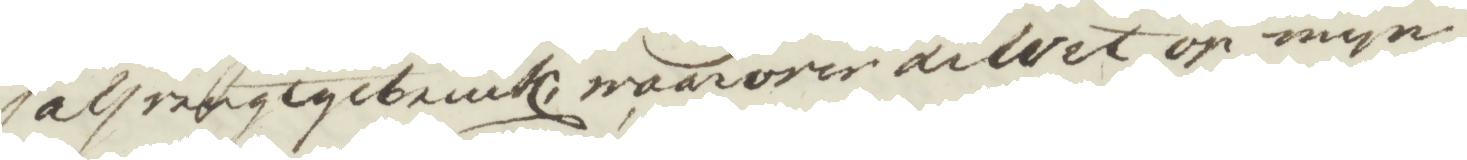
als vrugtgebruik, waarover de wet op myn
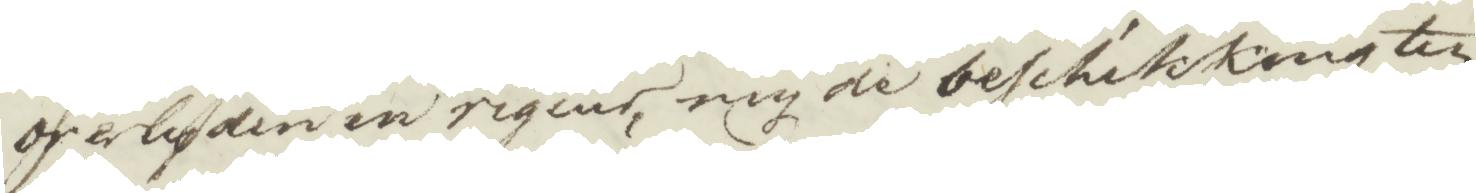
overlyden in vigeur, my de beschikking ten
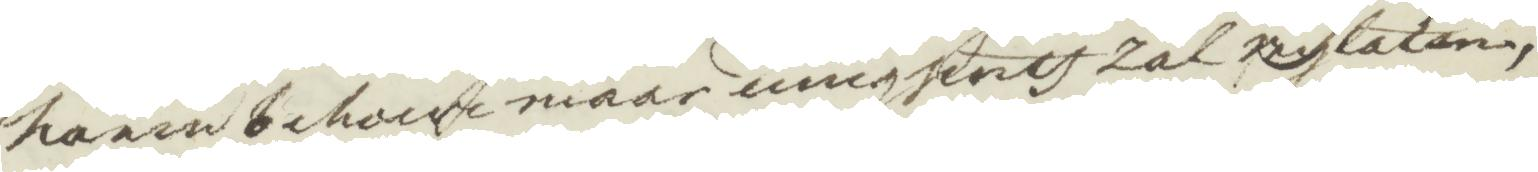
haren behoeve maar eenigsints zal vrylaten,
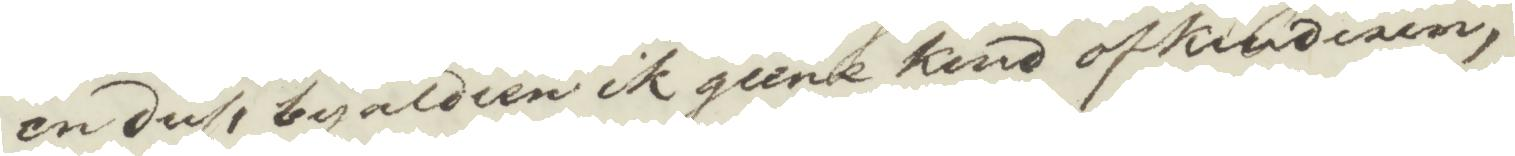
en dus by aldien ik geene kind of kinderen,
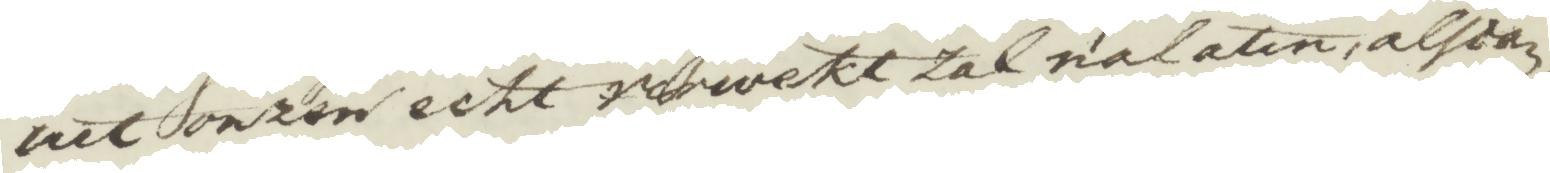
uit onzen echt verwekt zal nalaten, alsdan
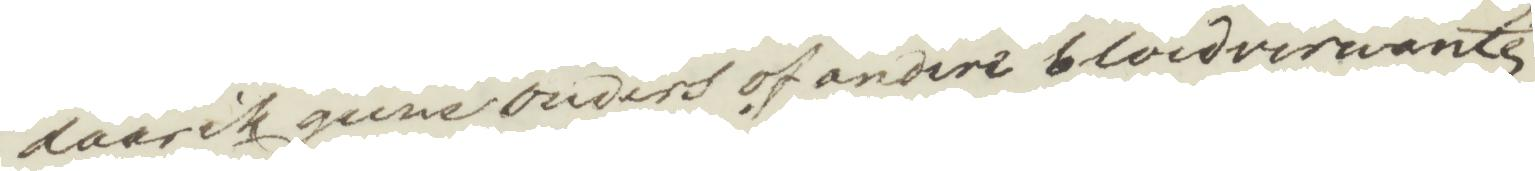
daar ik geene ouders of andere bloedverwanten
